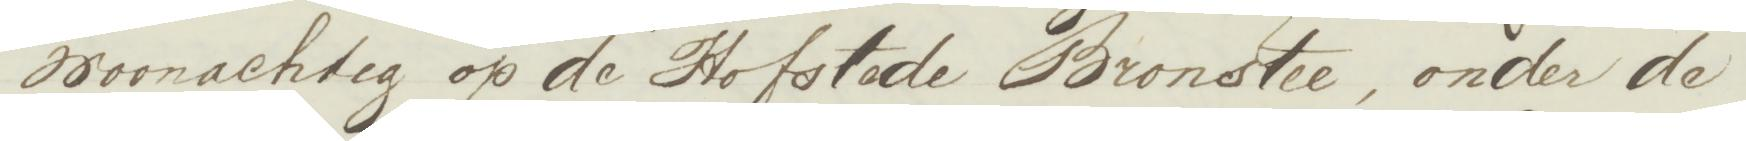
woonachtig op de Hofstede Bronstee, onder de
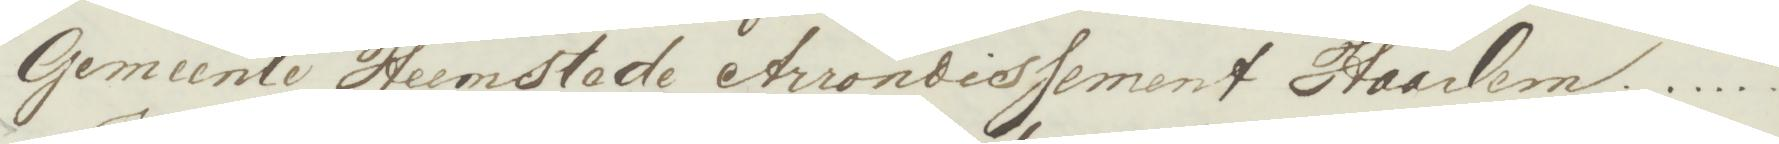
Gemeente Heemstede Arrondissement Haarlem . . . . .
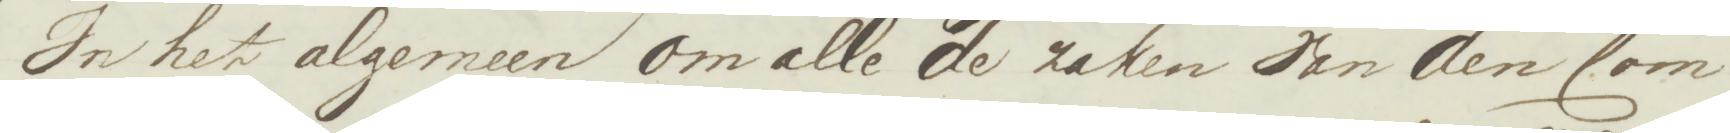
In het algemeen om alle de zaken van den Com
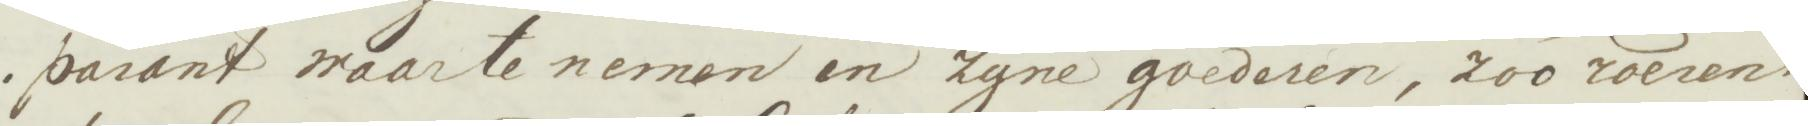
„parant waarte nemen en zyne goederen, zoo roeren„
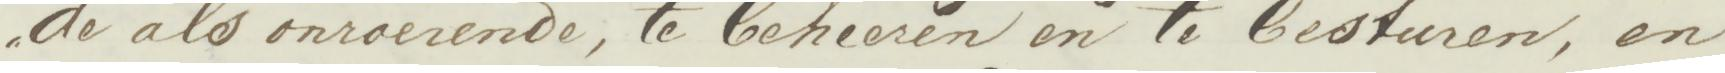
„de als onroerende, te beheeren en te besturen, en
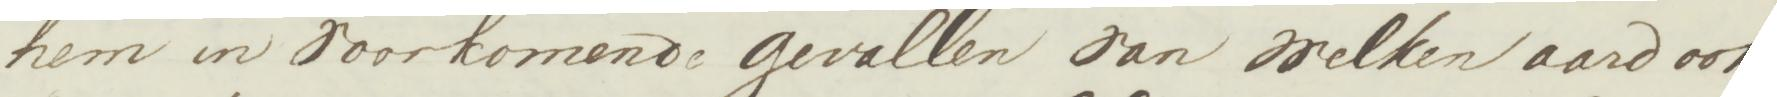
hem in voorkomende gevallen van welken aard ook
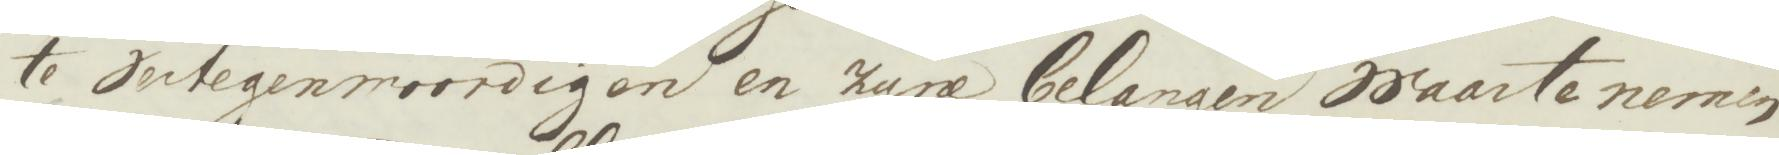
te vertegenwoordigen en zyne belangen waarte nemen
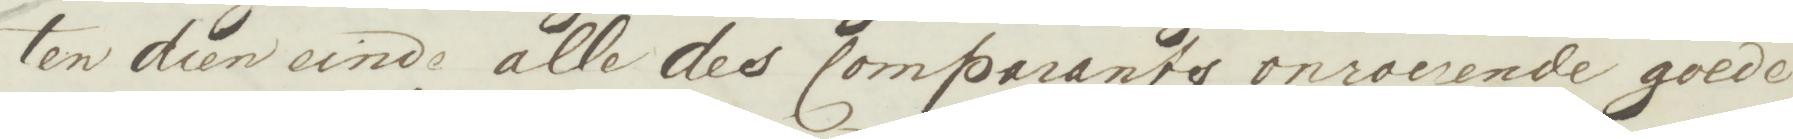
ten dien einde alle des Comparants onroerende goede
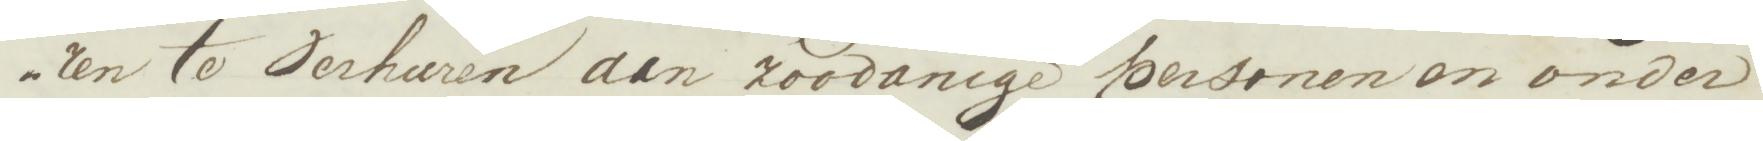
„ren te Verhuren aan zoodanige personen en onder
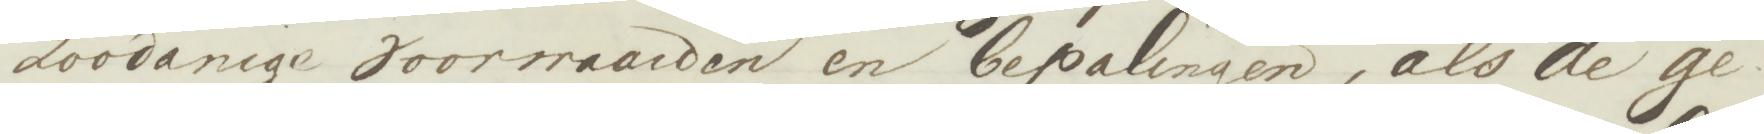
zoodanige voorwaarden en bepalingen, als de ge
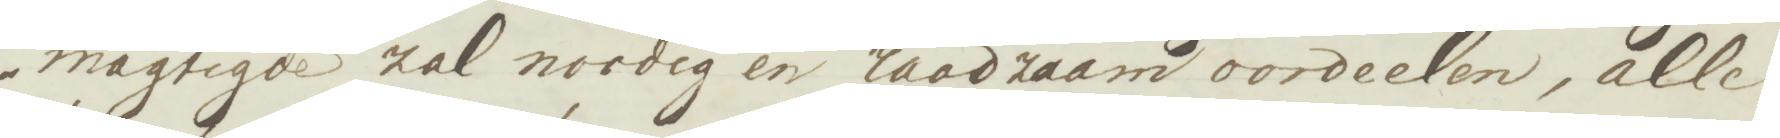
„magtigde zal noodig en raadzaam oordeelen, alle
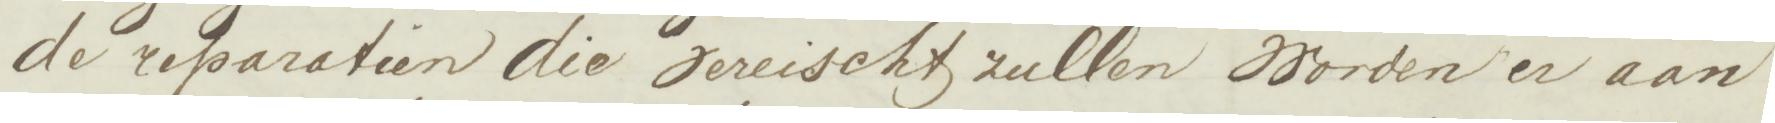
de reparatien die vereischt zullen worden er aan
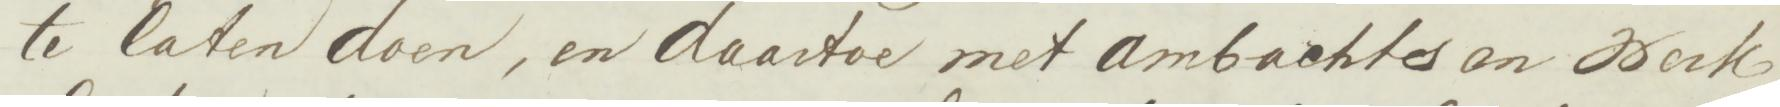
te laten doen, en daartoe met ambachts en werk
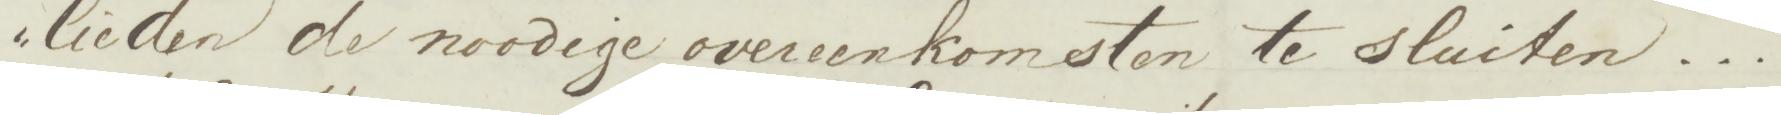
„lieden de noodige overeenkomsten te sluiten . . .
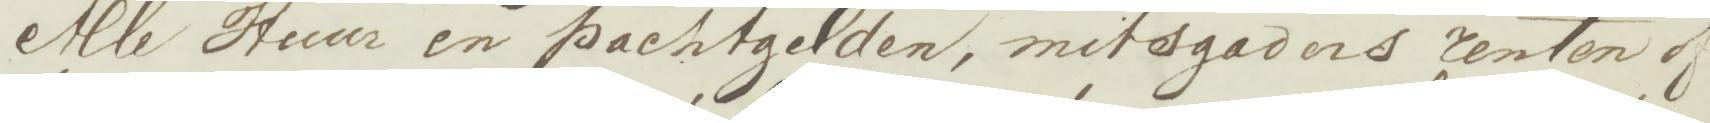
Alle Huur en pachtgelden, mitsgaders renten of
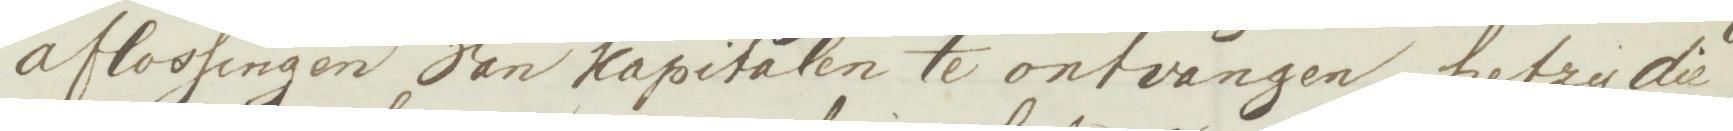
aflossingen van kapitalen te ontvangen, hetzy die
